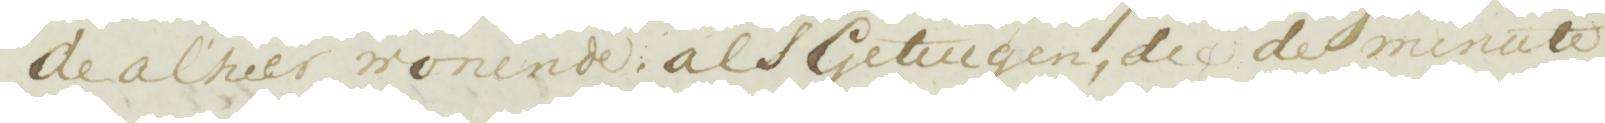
de alhier wonende, als Getuigen, die de minute
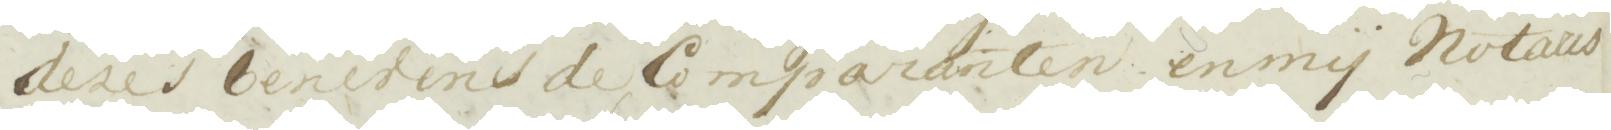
dezes benevens de Comparanten en mij Notaris
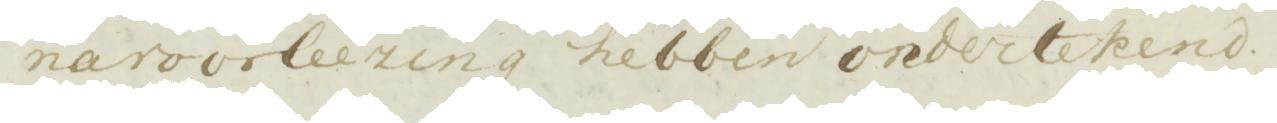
na voorleezing hebben ondertekend.
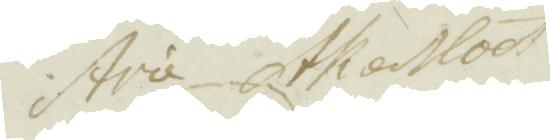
Arie Akerhoet
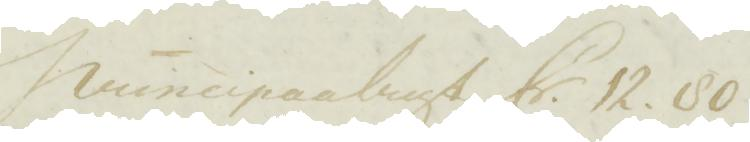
Principaalregt ƒ. 12.80
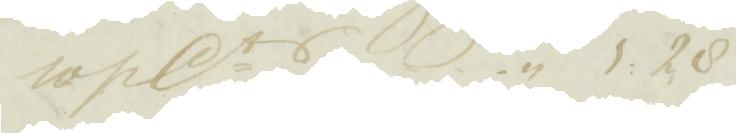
10 pC=ts . „ 1: 28
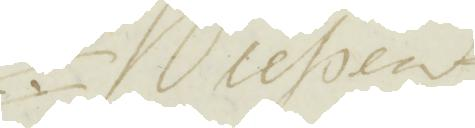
J Diepen
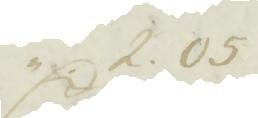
„ .2. 05
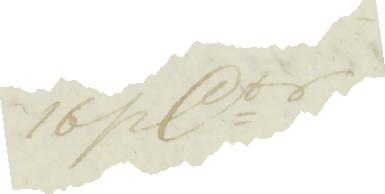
16 pC=ts
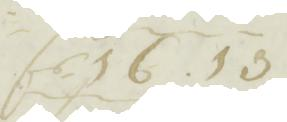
ƒ. 16. 13
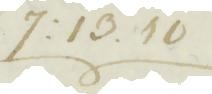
7: 13. 10
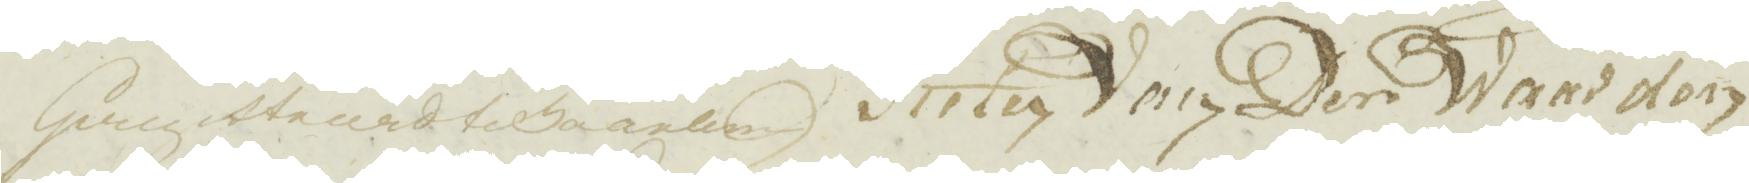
Geregistreerd te Haarlem Pieter Van Der Waarden
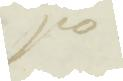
vo
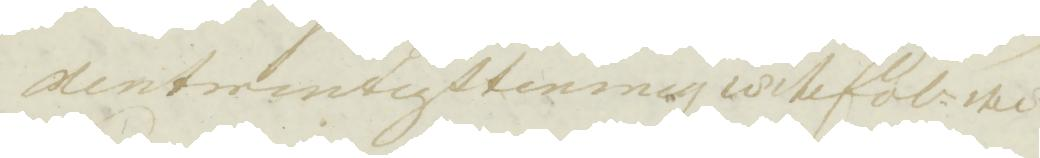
den twintigsten mey 1814 fol= 148
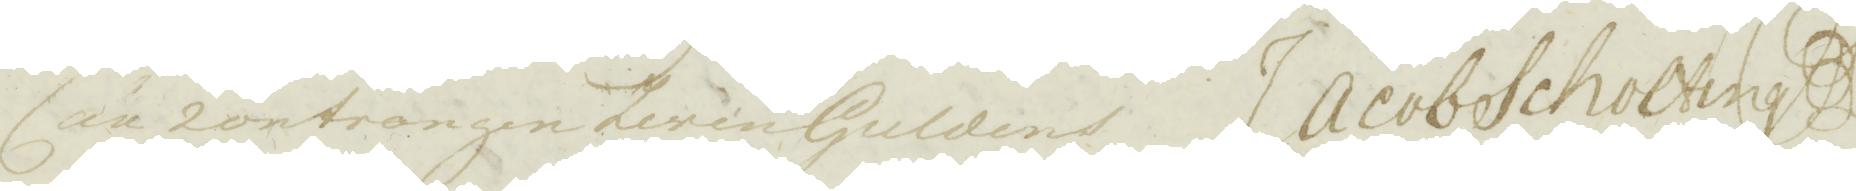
Car 2 ontvangen Zeven Guldens Jacob Scholting
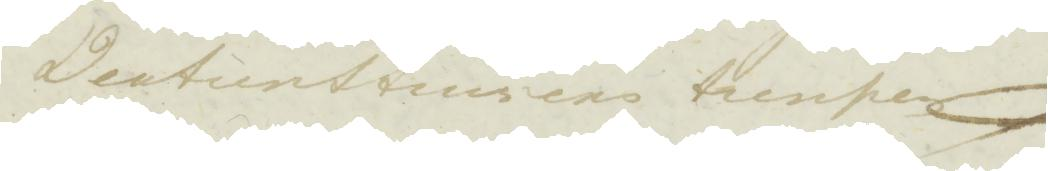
Dertien stuivers tien pen
